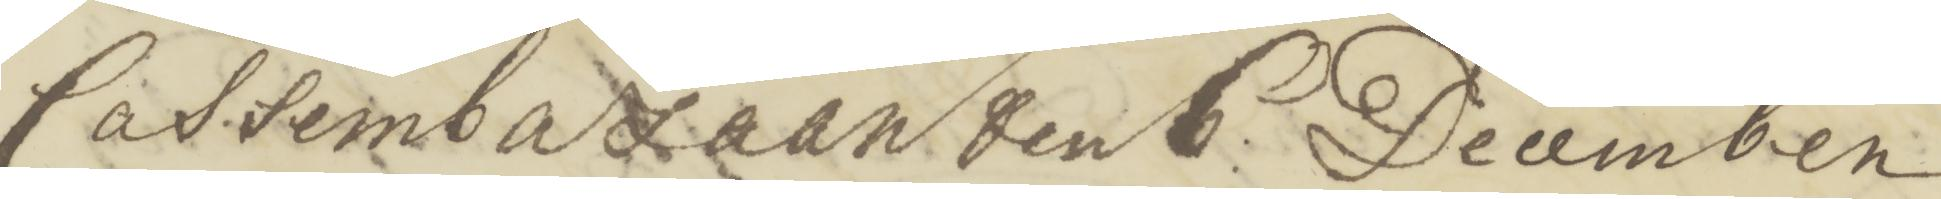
Cassembazaar den 6:' December
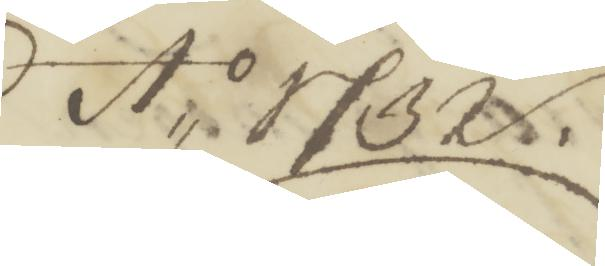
A„o1732.
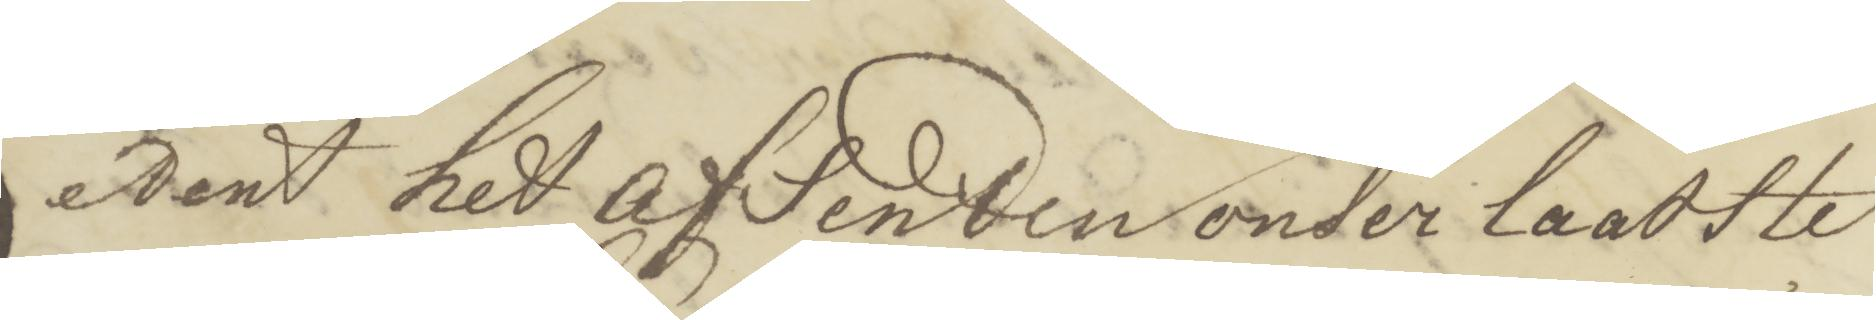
Zedert het afsenden onser laatste
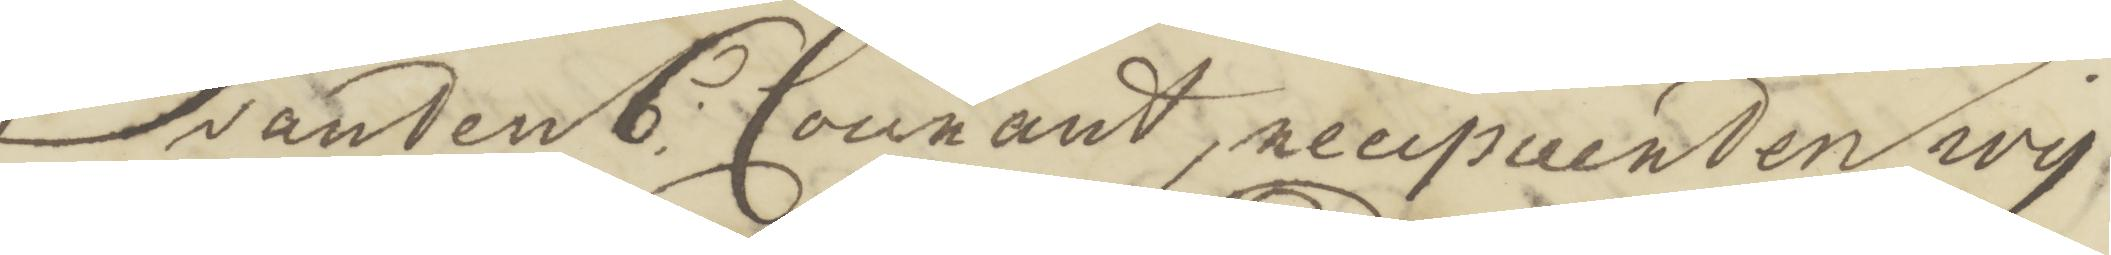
van den 6: Courant, recipieerden wij
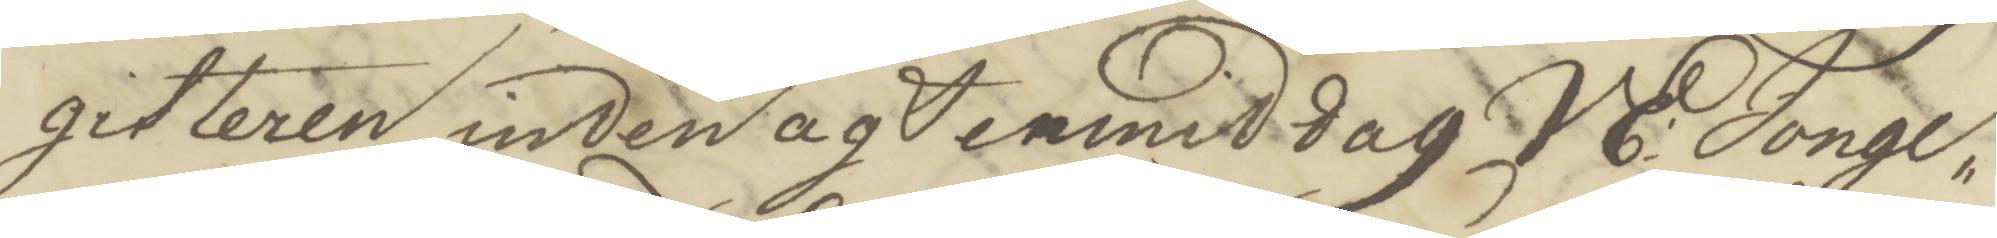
gisteren in den agtermiddag UE: Ionge„
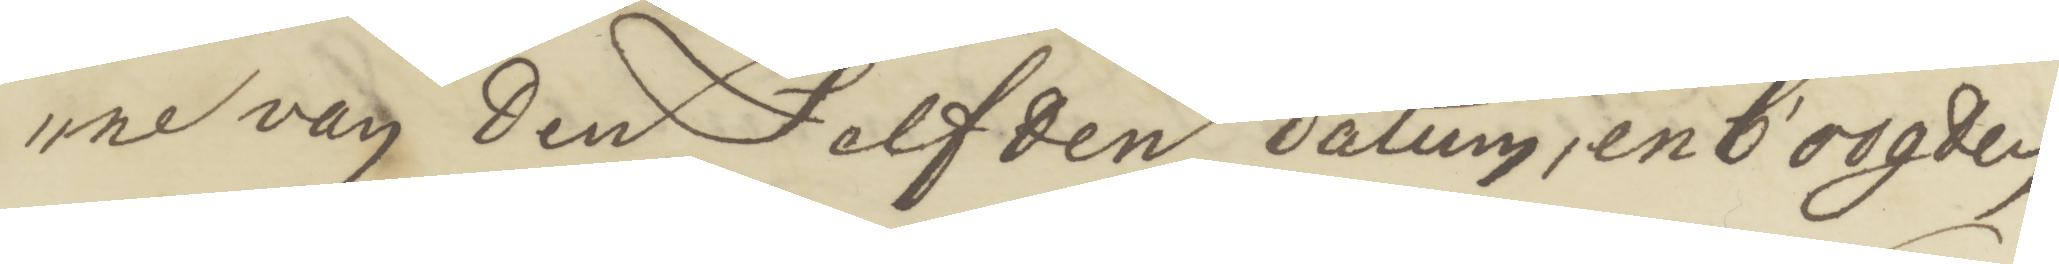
„re van den selfden datum, en b'oogden
